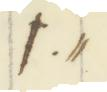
1. „ „ . 13. „ 71. „ „ 11 „ „ „ „ 55 „ 11 „.
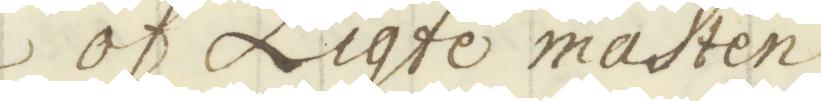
3. p=s spieren of ligte masten te weeten
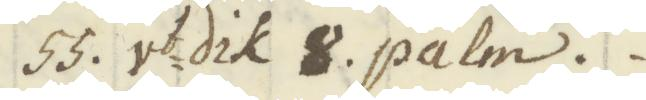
1. pr lb. . 14. lang 55. v=t dik 8. palm . . .
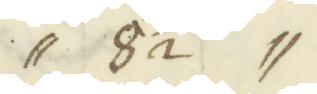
1. „ „ . . 15. „ 69. „ „ 8½ „ . .
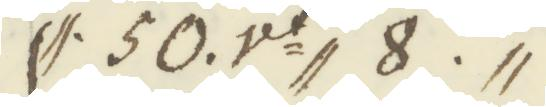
. 50. v=t „ 8 . „
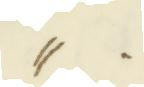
1. „ „ . 16. „ 55. „ „ 8. „ . . .
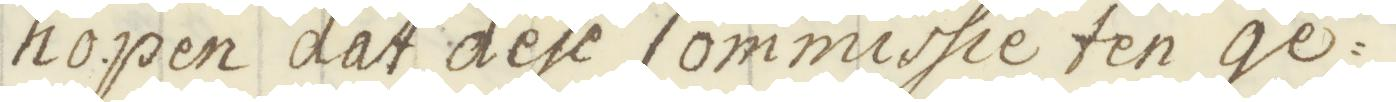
Waermeede verhopen dat dese Commissie ten ge=
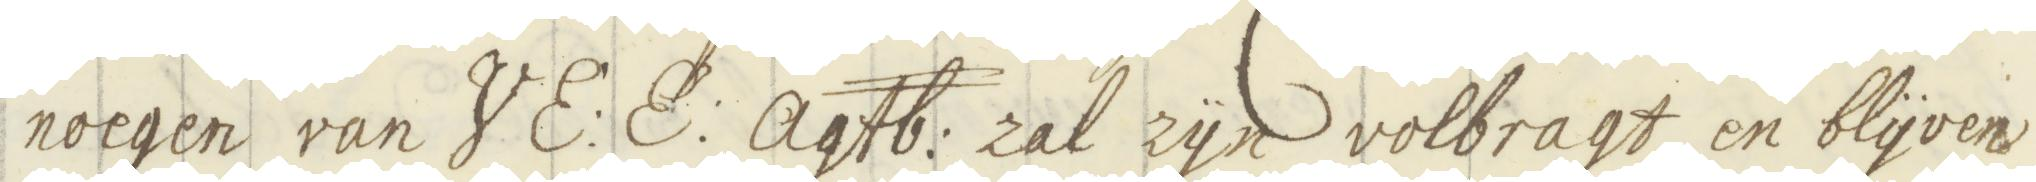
noegen van UE:E: Agtb: zal zijn volbragt en blijven
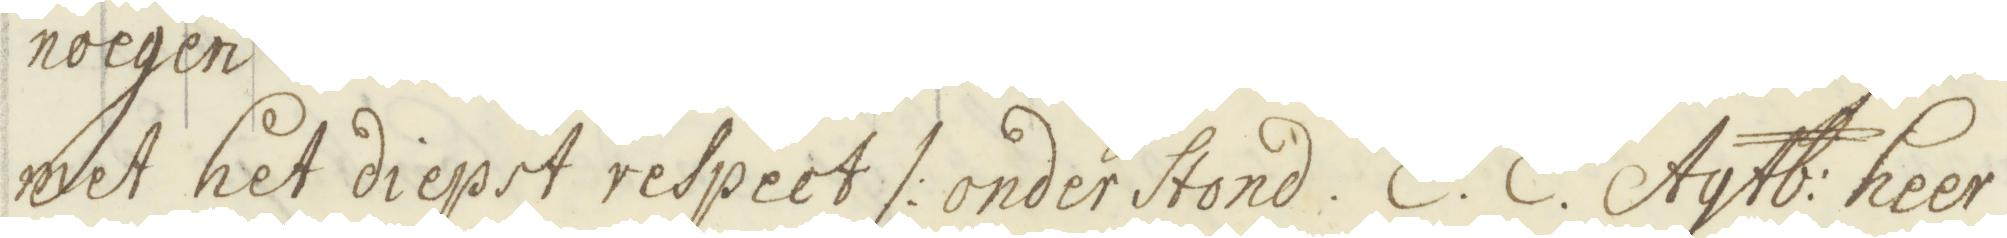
met het diepst respect /: onderstond. E.E. Agtb:r heer
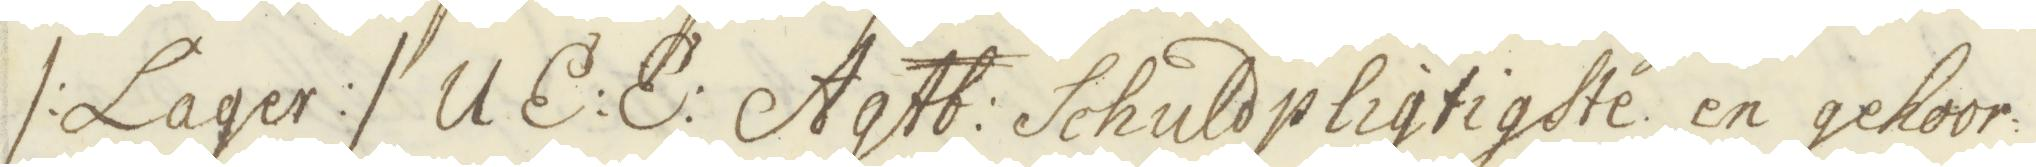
/:Lager:/ UE:E: Agtb: schuldpligtigste en gehoor=
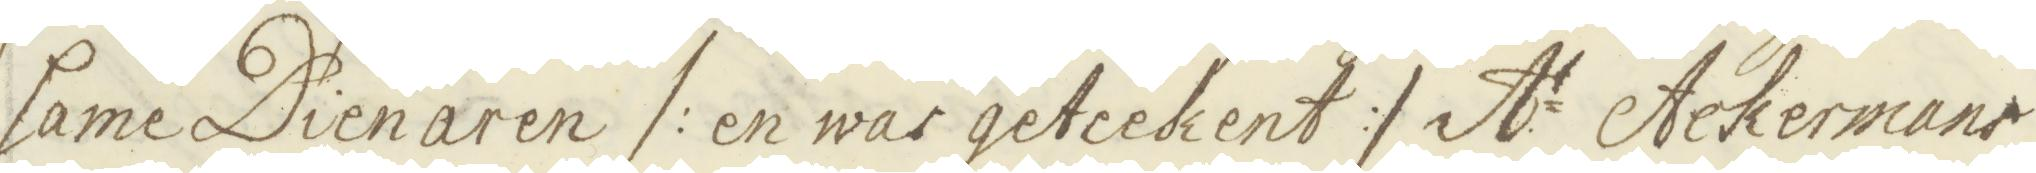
same Dienaren /: en was geteekent :/ A:t Ackermans
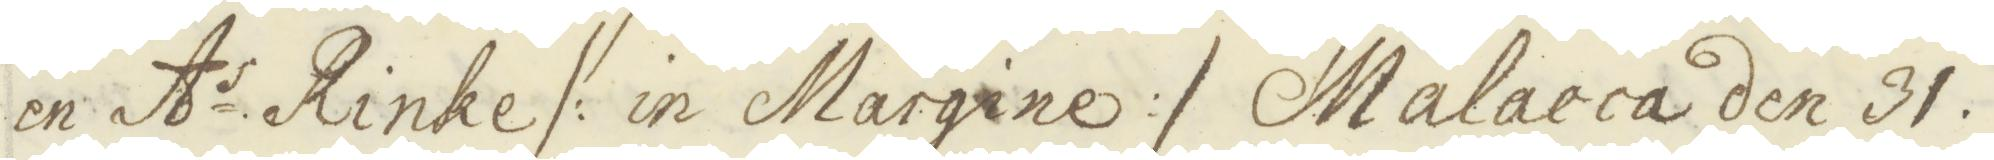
en A=s Rinke /: in Margine :/ Malacca den 31.
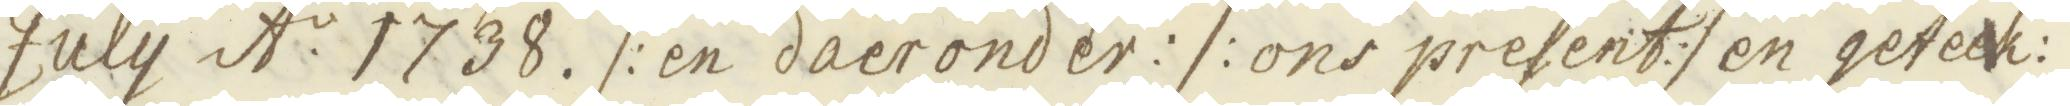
Julij A:o 1738. /: en daer onder :/: ons present:/ en geteek:
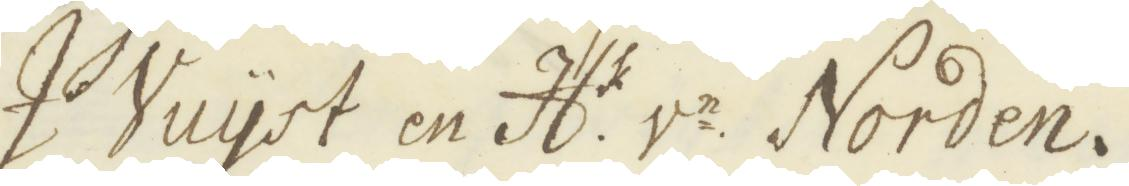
Js Vuijst en H.k v=n Norden.
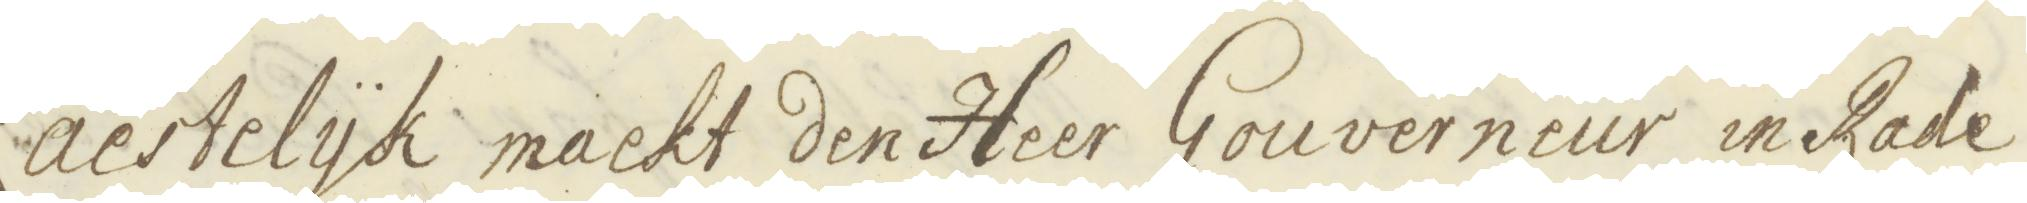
Laestelijk maekt den Heer Gouverneur in Rade
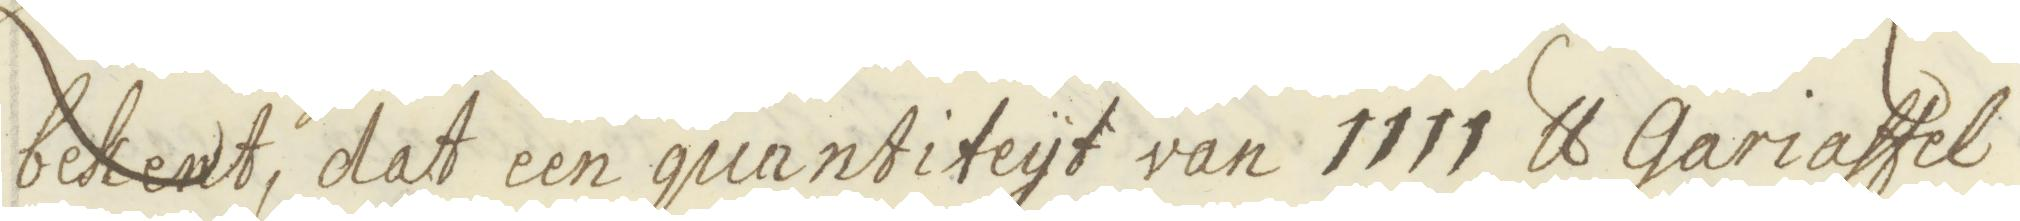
bekent, dat een quantiteijt van 1111 lb gariaffel
